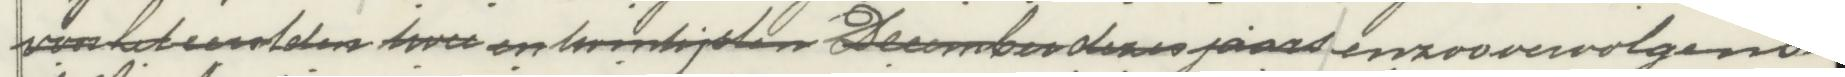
voor het eerst den twee en twintigsten December dezes jaars| en zoo vervolgens
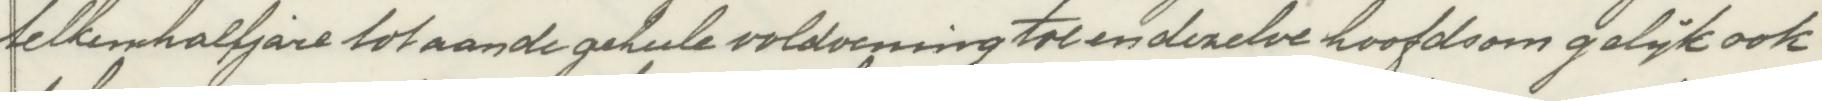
telken halfjare tot aan de geheele voldoening toe en dezelve hoofdsom gelijk ook
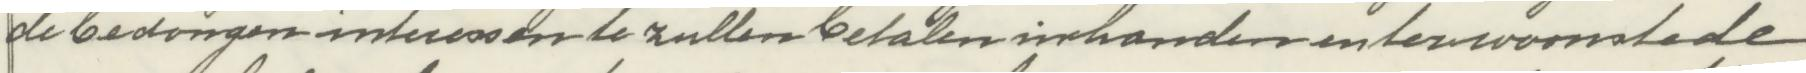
de bedongen interessen te zullen betalen in handen en ter woonstede
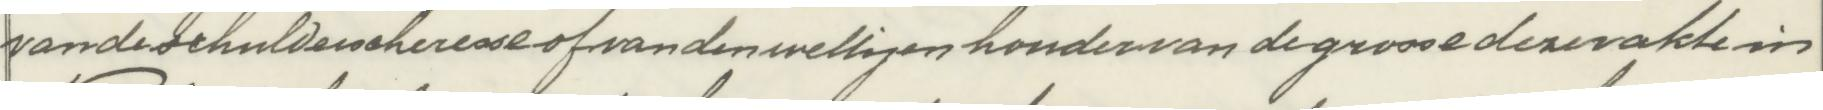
van de schuldeischeresse of van den wettigen houder van de grosse dezer akte in
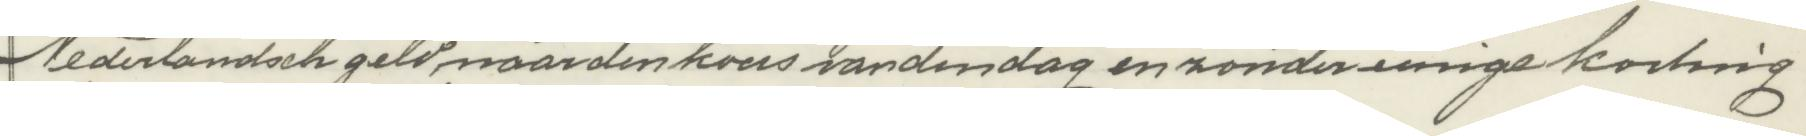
Nederlandsch geld, naar den koers van den dag en zonder eenige korting
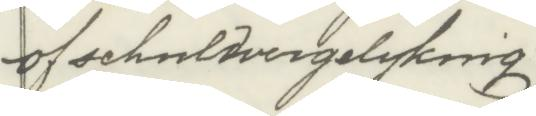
of schuldvergelyking
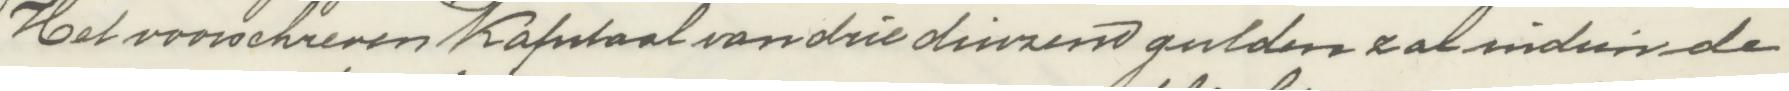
Het voorschreven Kapitaal van drie duizend gulden zal indien de
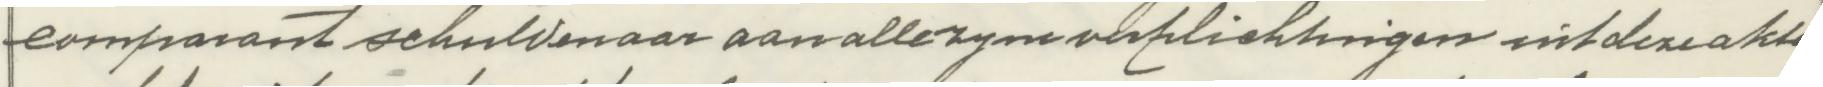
comparant schuldenaar aan alle zyne verplichtingen uit deze akte
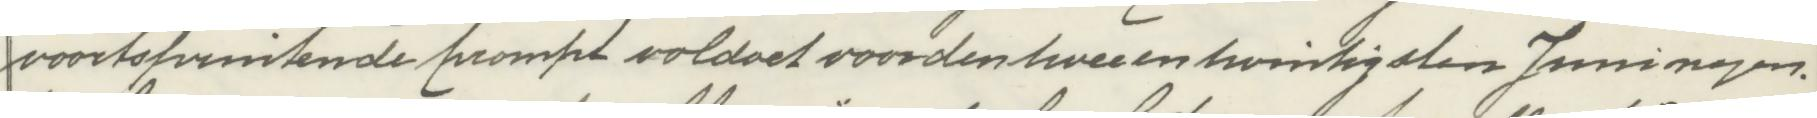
voortspruitende prompt voldoet voor den twee en twintigsten Juni negen.
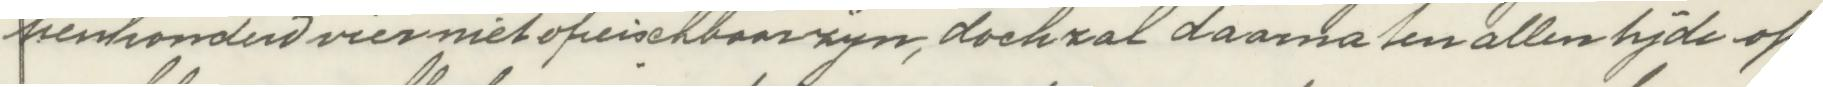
tienhonderd vier niet opeischbaar zijn, doch zal daarna ten allen tijde op
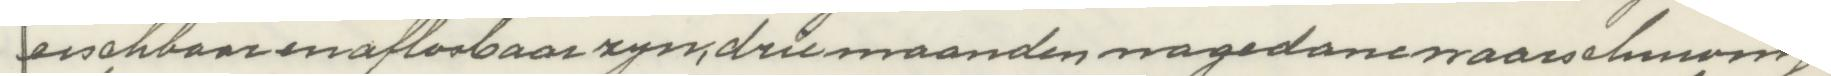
eischbaar en aflosbaar zijn, drie maanden na gedane waarschuwing
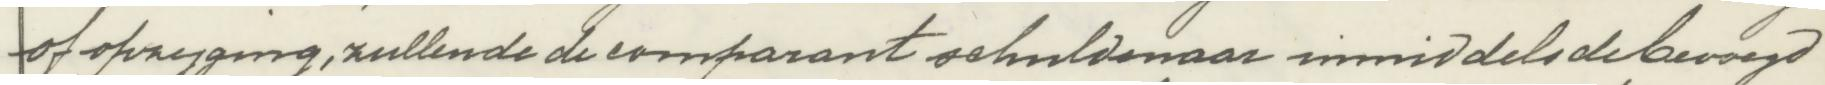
of opzegging, zullende de comparant schuldenaar inmiddels de bevoegd
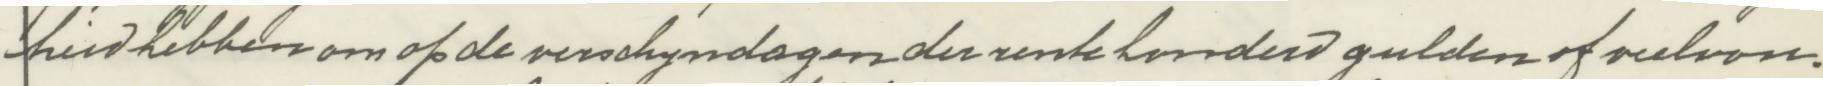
heid hebben om op de verschyndagen der rente honderd gulden of veelvou.
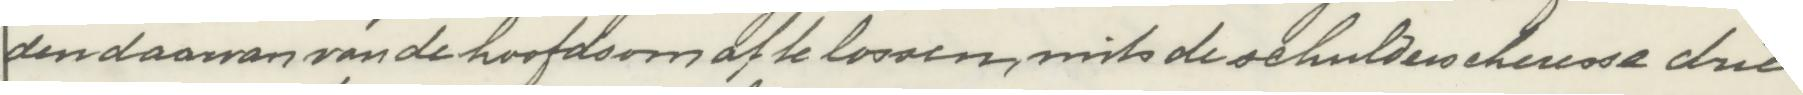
den daarvan van de hoofdsom af te lossen, mits de schuldeischeresse drie
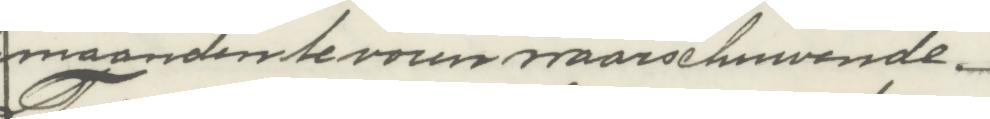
maanden te vooren waarschuivende
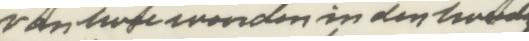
van twee woorden in den tweede
